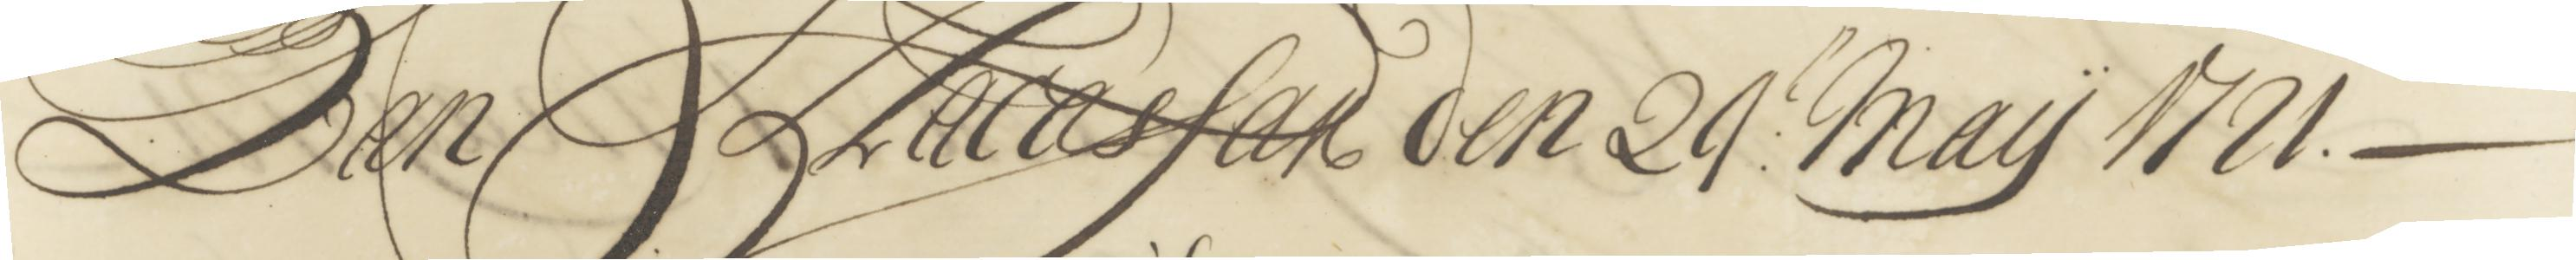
Van Macassar den 24:' Maij 1721.—
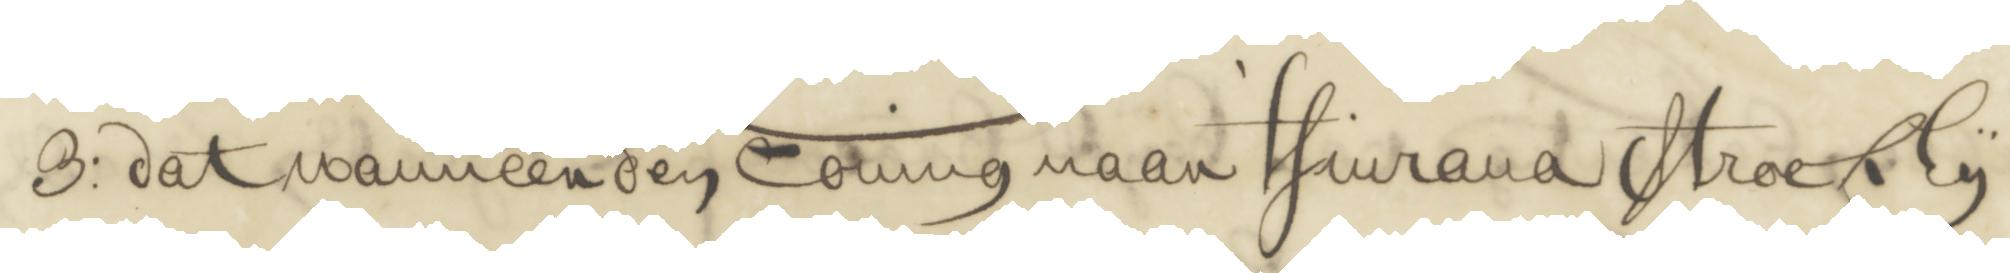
3: dat wanneer den Coning naar 'tsinrana vertrock hij
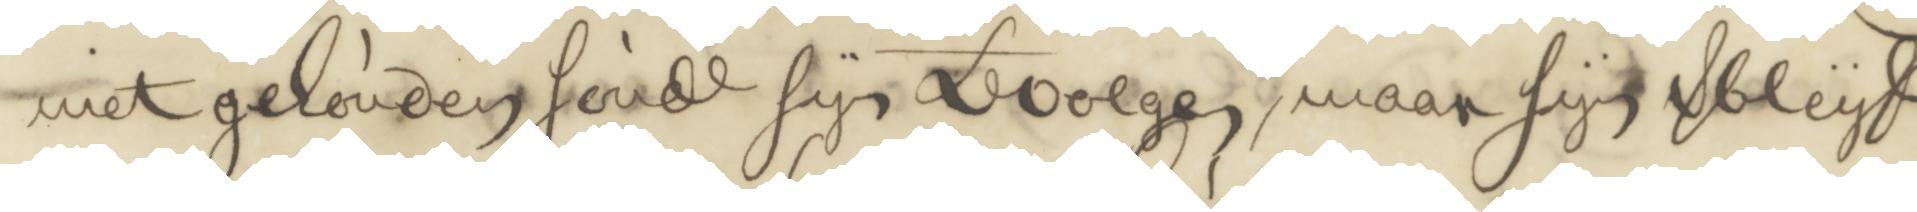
niet gehouden soude sijn tevolgen, maar sijn verbleijf
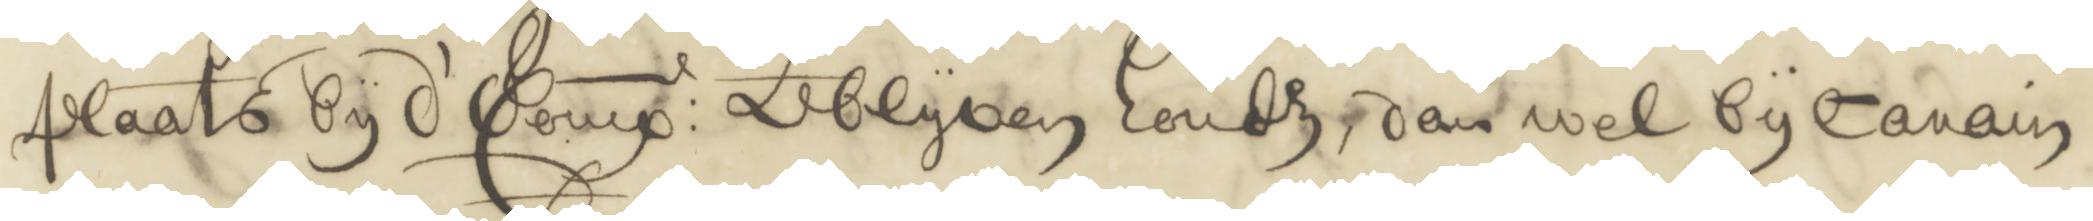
plaats bij d’ Ecomp:e te blijven houden, dan wel bij Carain
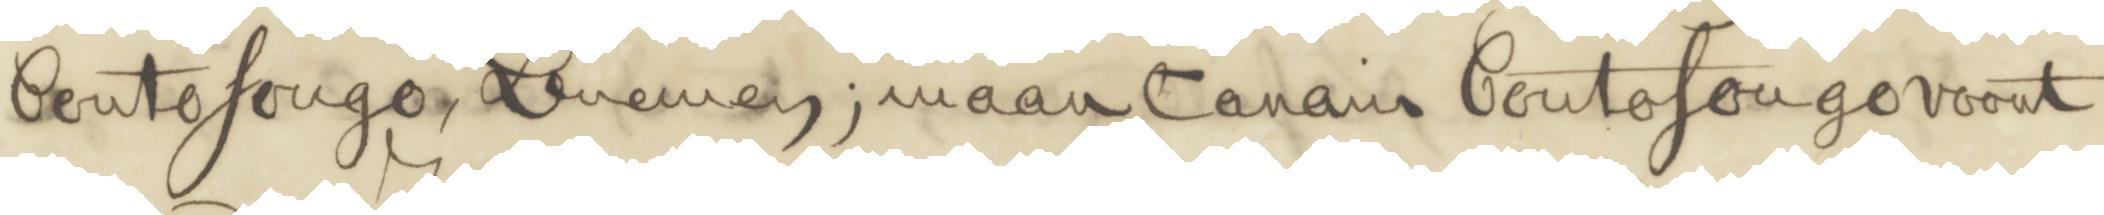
bonto songo tenemen; maar Carain bontosongo voort
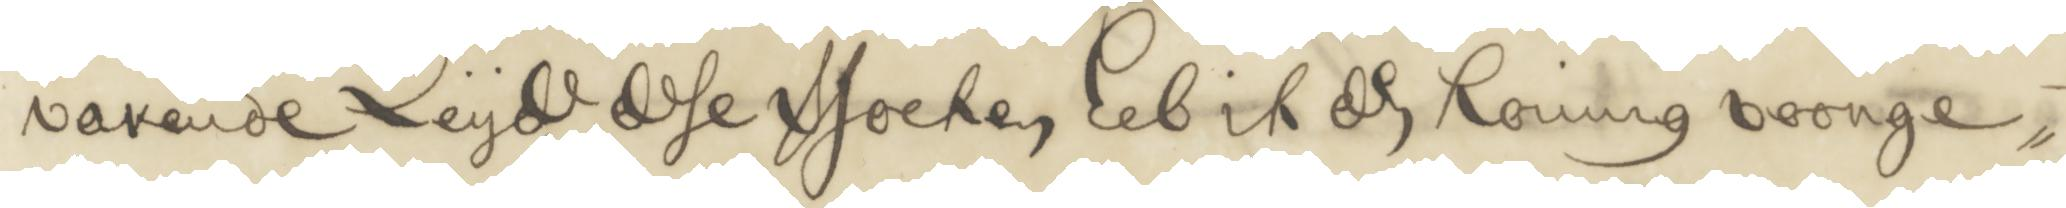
varende zeijde dese versoeken heb ik den koning voorge„
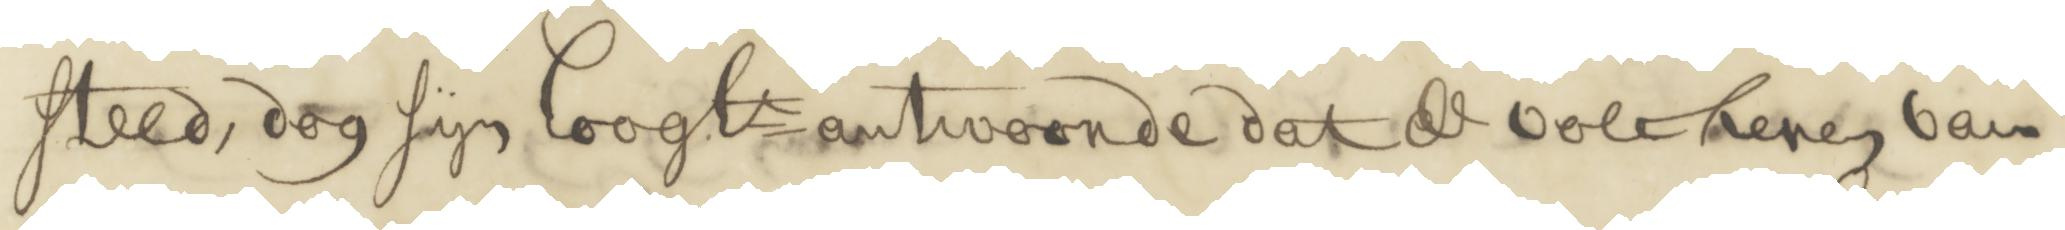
steld, dog sijn hoogh=t antwoorde dat de volckeren van
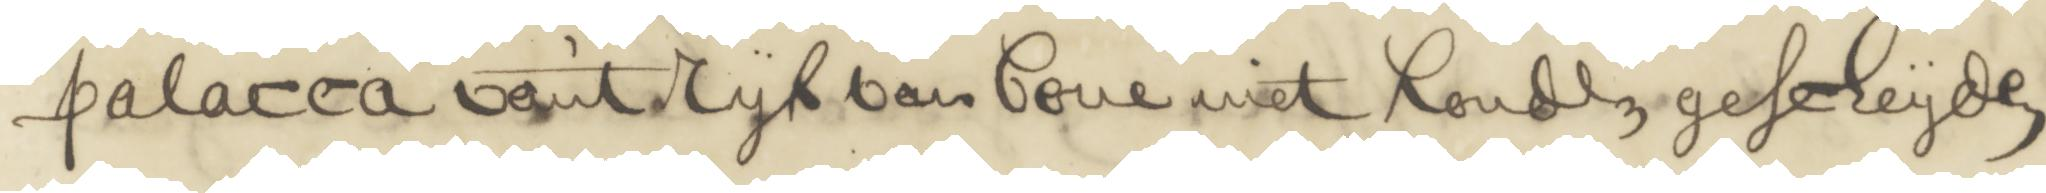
palacca van’t Rijk van bone niet konden gescheijden
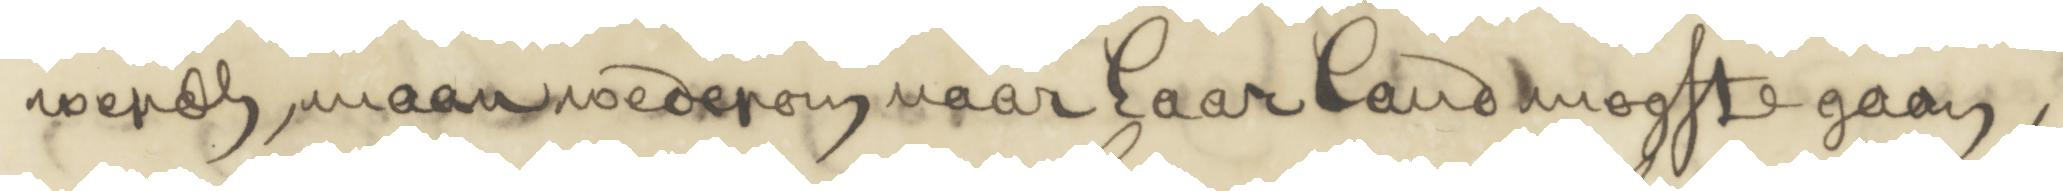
werden, maar wederom naar haar land mogste gaan,
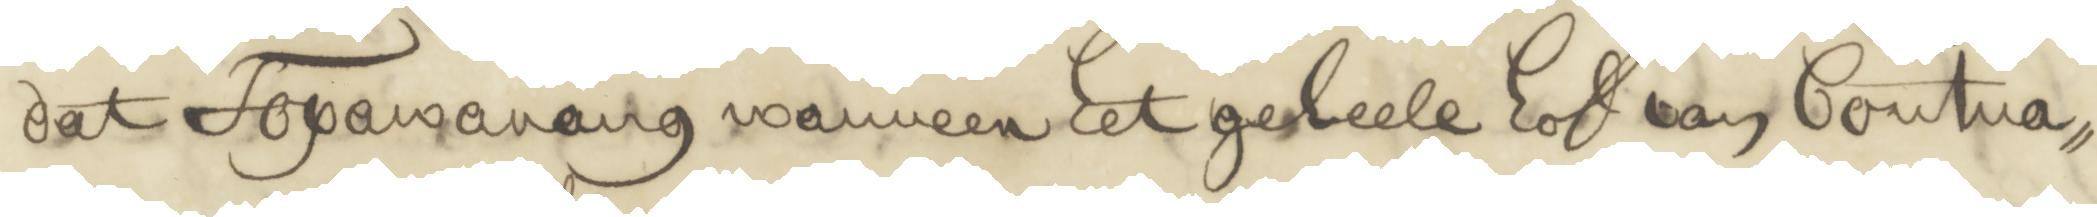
dat Topawarang wanneer het geheele hof van bontua„
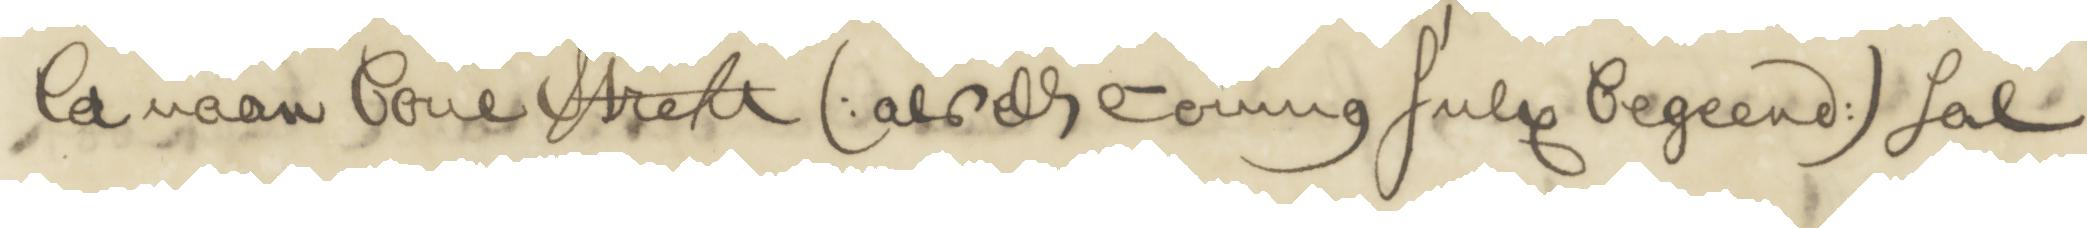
la naar bone vertrekt (:als den coning sulx begeerd:) sal
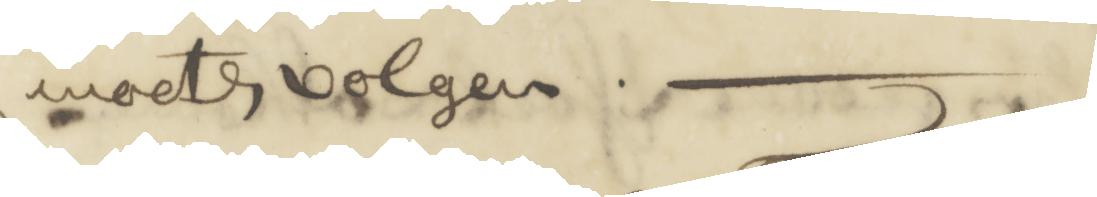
moeten volgen. —
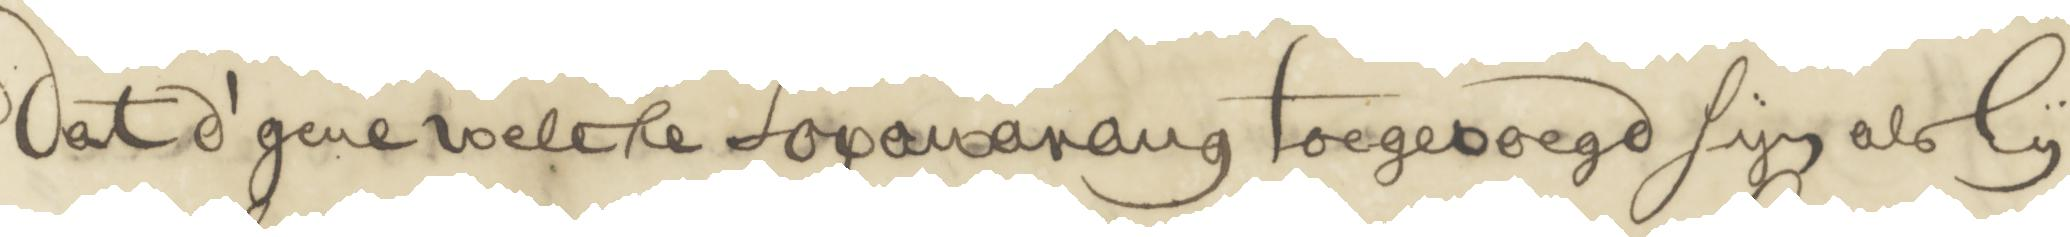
dat d’ gene welcke Topawarang toegevoegd sijn als hij
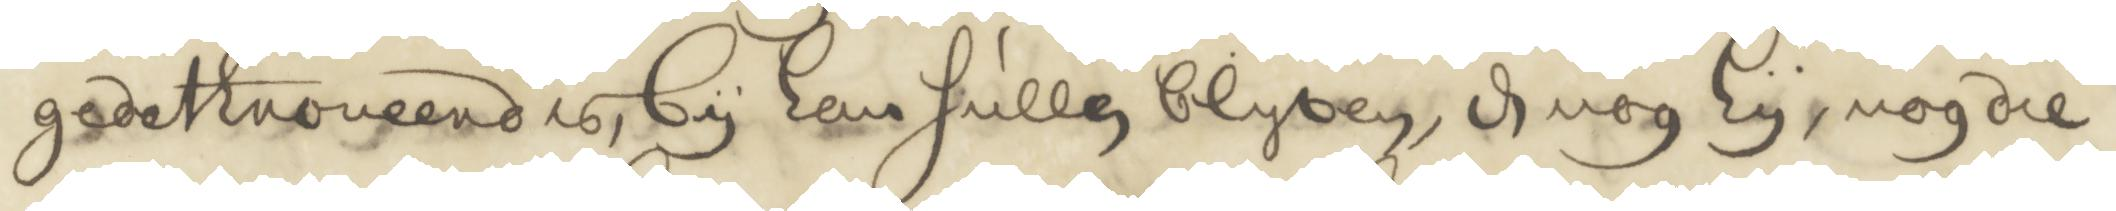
gedethroneerd is, bij hem sullen blijven, en nog hij, nog die
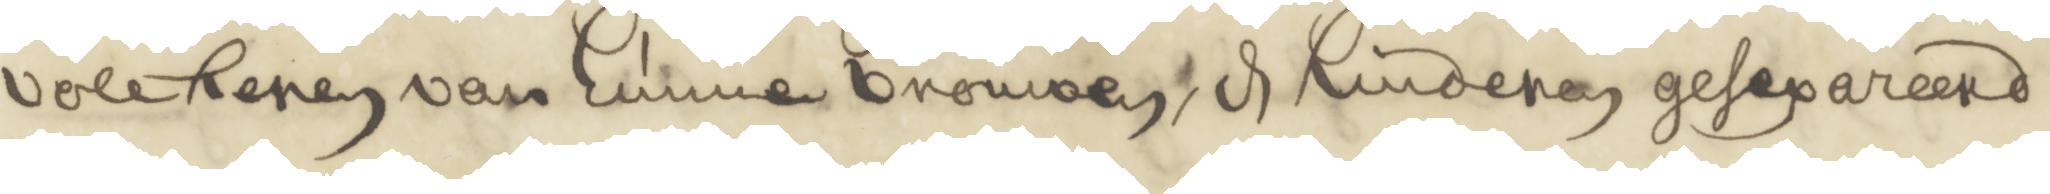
volckeren van hunne vrouwen, en kinderen gesepareerd
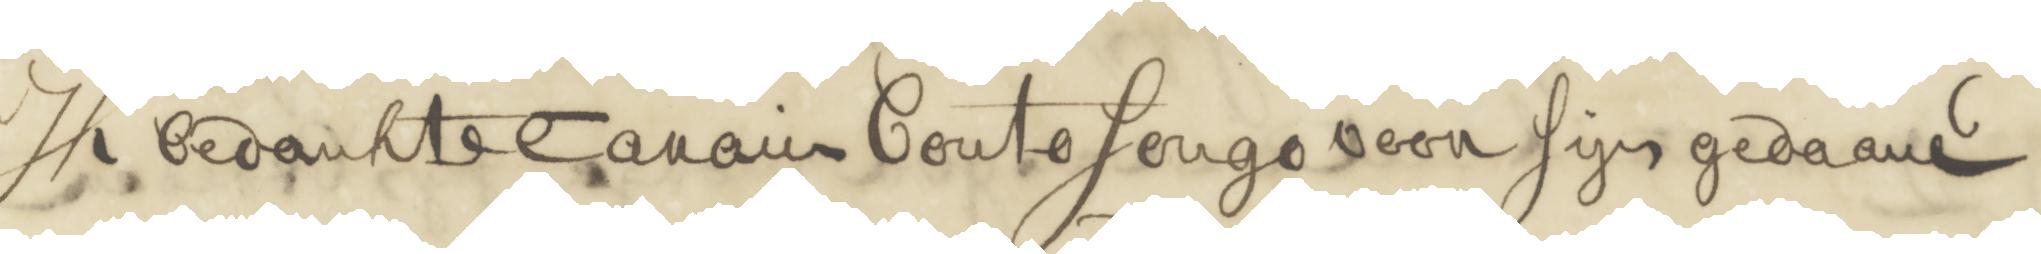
Jk bedankte Carain bonto songo voor sijn gedaane
